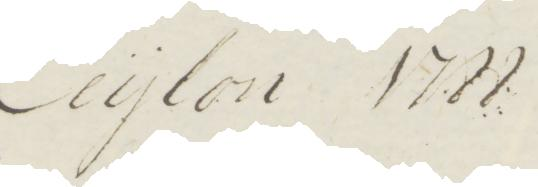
Ceijlon 1788:
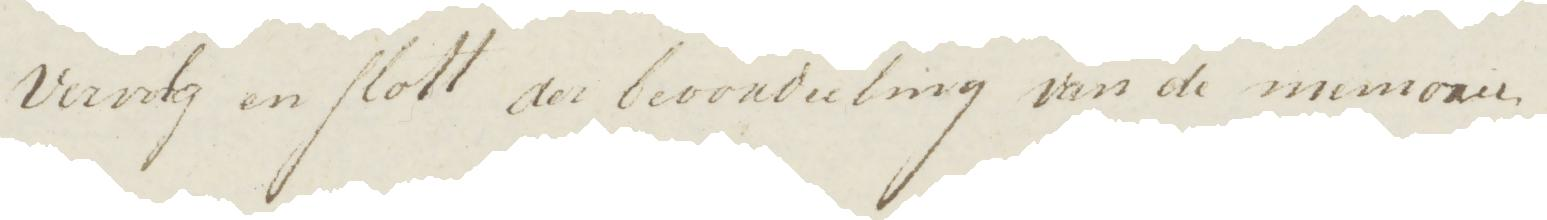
vervolg en slott der beoordeeling van de memorie
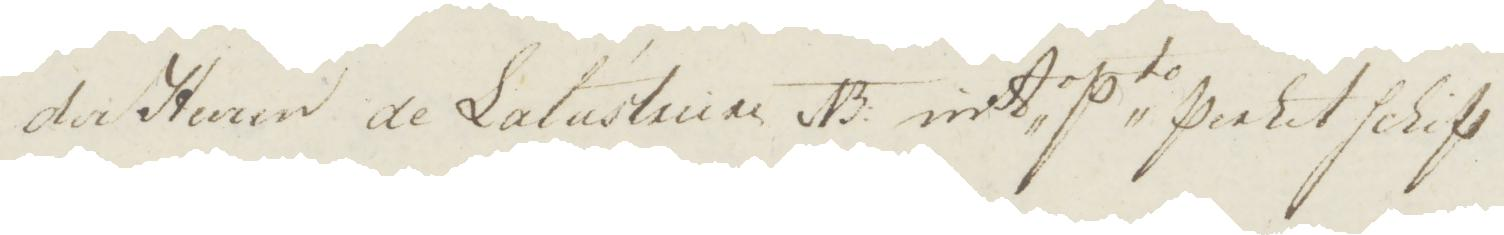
der Heeren de Lalastriere NB: in A„o P„to per het schip
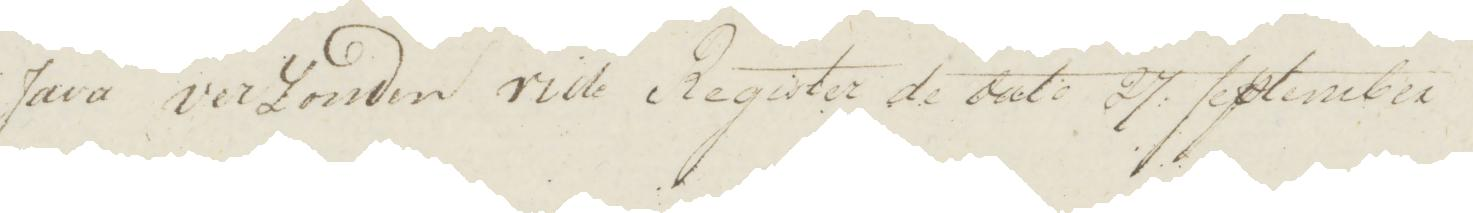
Java verzonden vide Register de dato 27: september
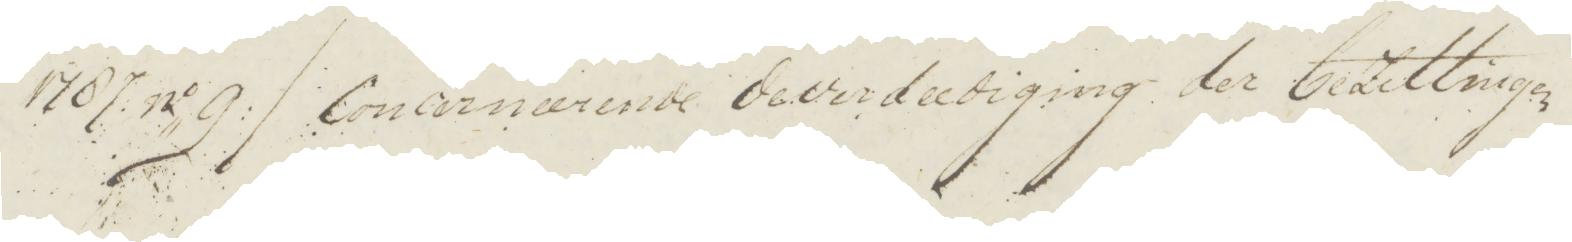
1787: n„o 9:/ Concerneerende de verdeediging der bezittingen
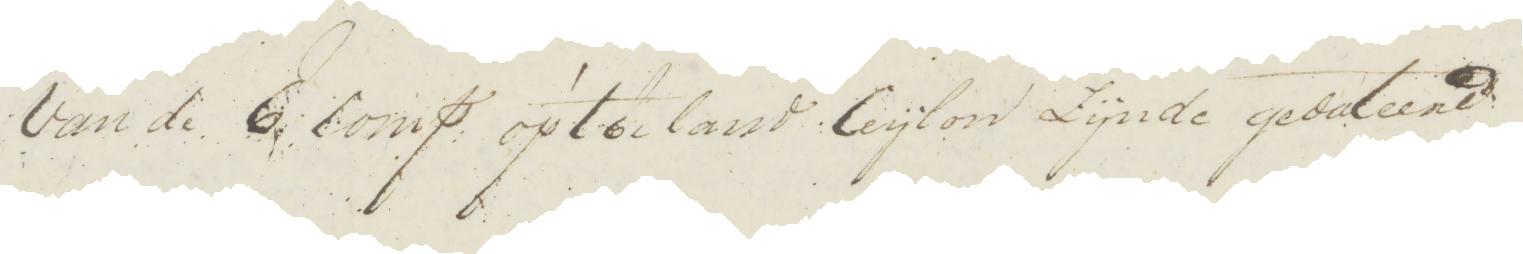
van de E: Comp: op 't Eiland: Ceijlon zijnde gedateerd
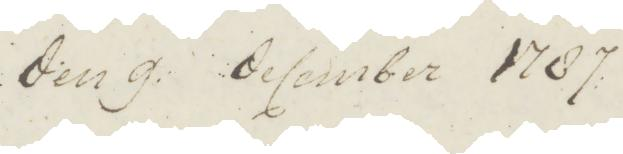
den 9. december 1787.
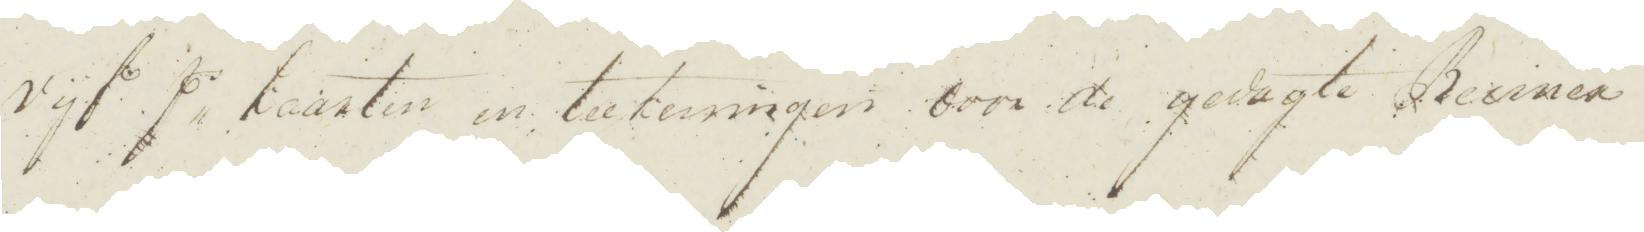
vijf P„s kaarten en teekeningen, door de gedagte Reimer
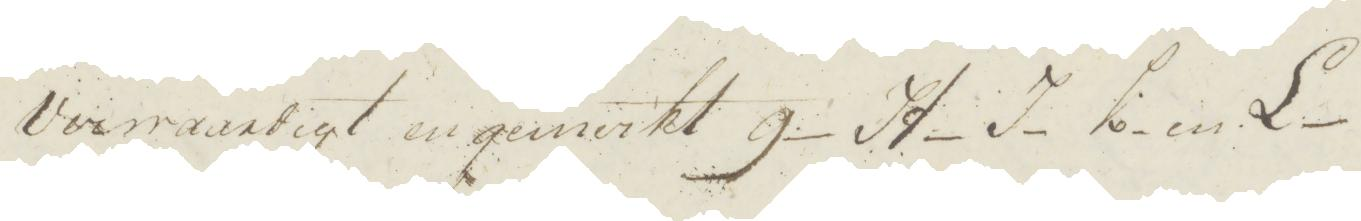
Verwaardigt en gemerkt 9—Jd—J- k- en L—
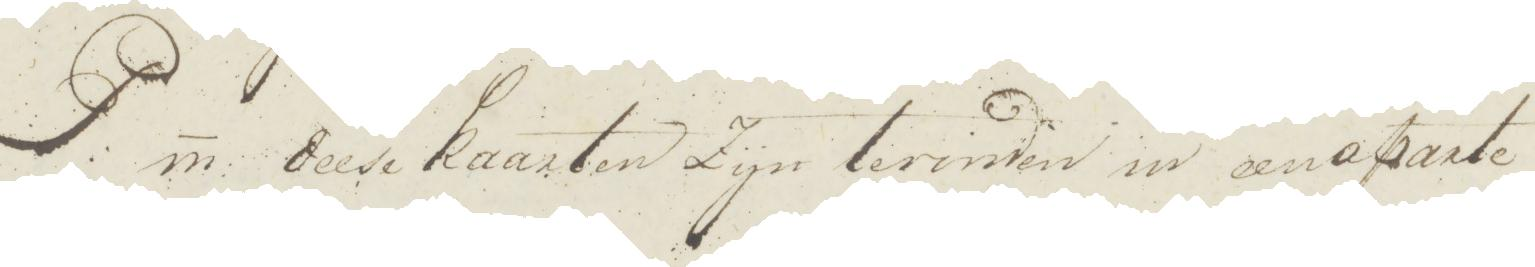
P:m deese kaarten Zijn tevinden in een aparte
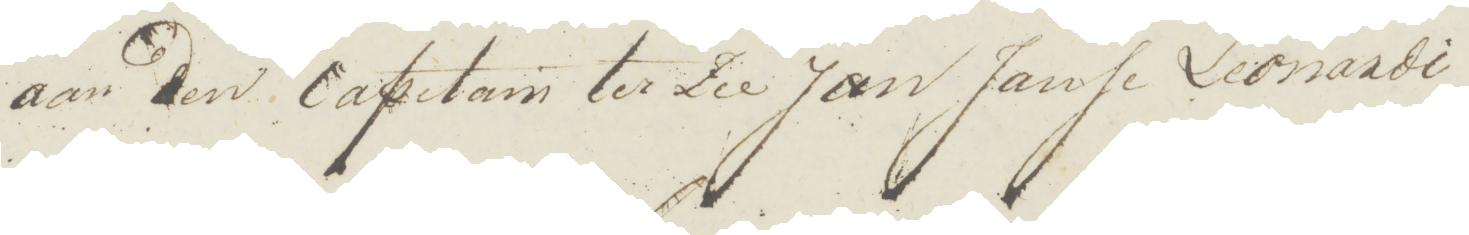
aan den Capitain ter Zee Jan Janse Leonardi
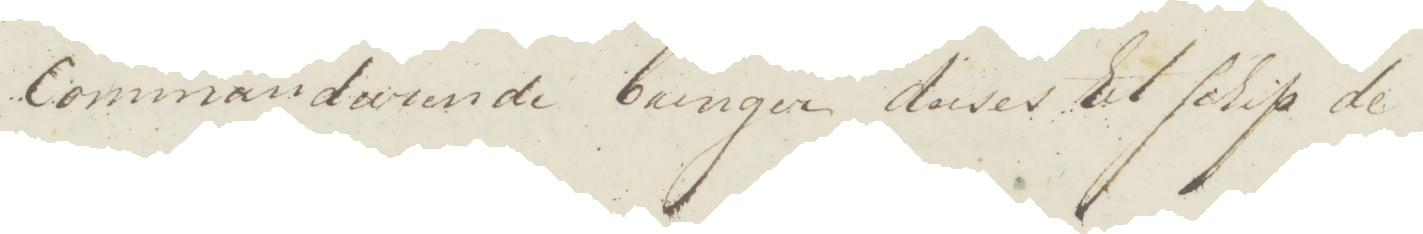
Commandeerende brenger deeses het schip de
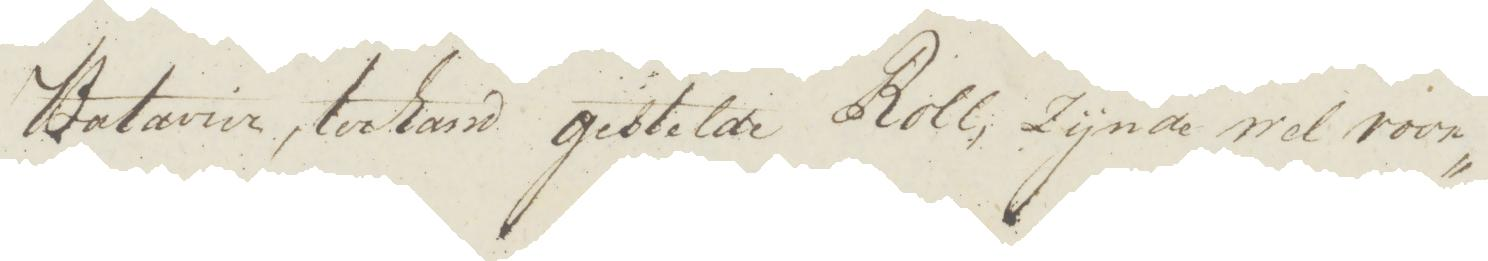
Batavia, terhand gestelde Roll, zijnde wel voor„
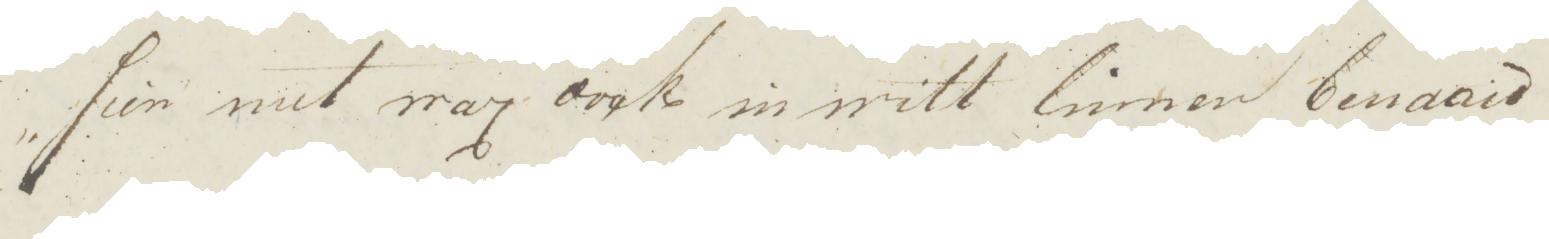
sien met wax doek in witt linnen benaaid
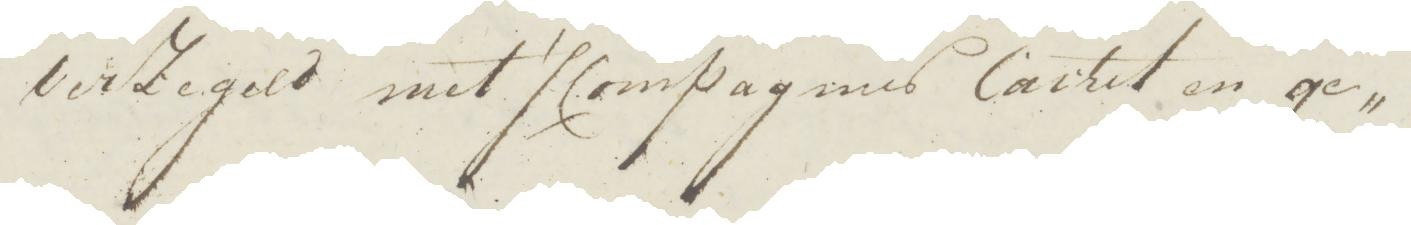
verzegeld met 's Compagnies Cachet en ge„
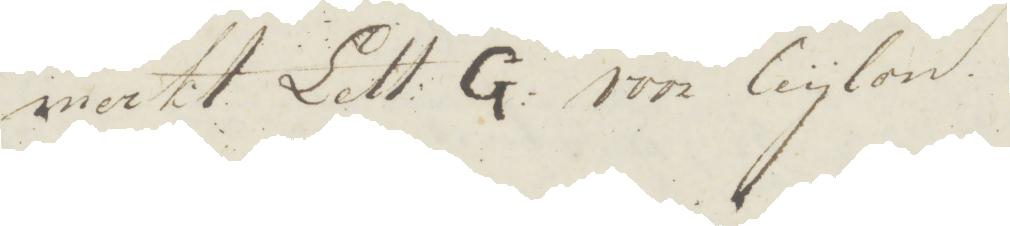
merkt Lett: C: voor Ceijlon.
